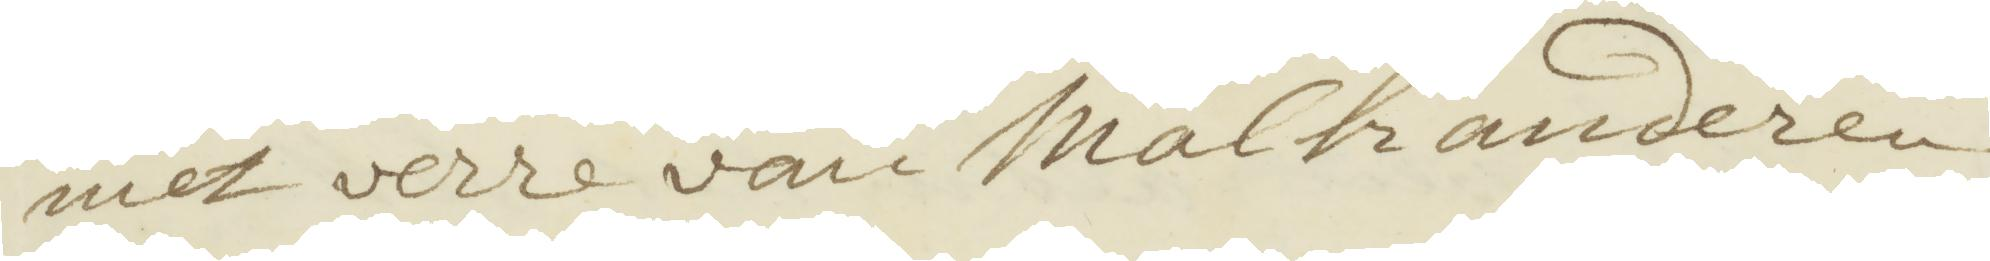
niet verre van Malkanderen
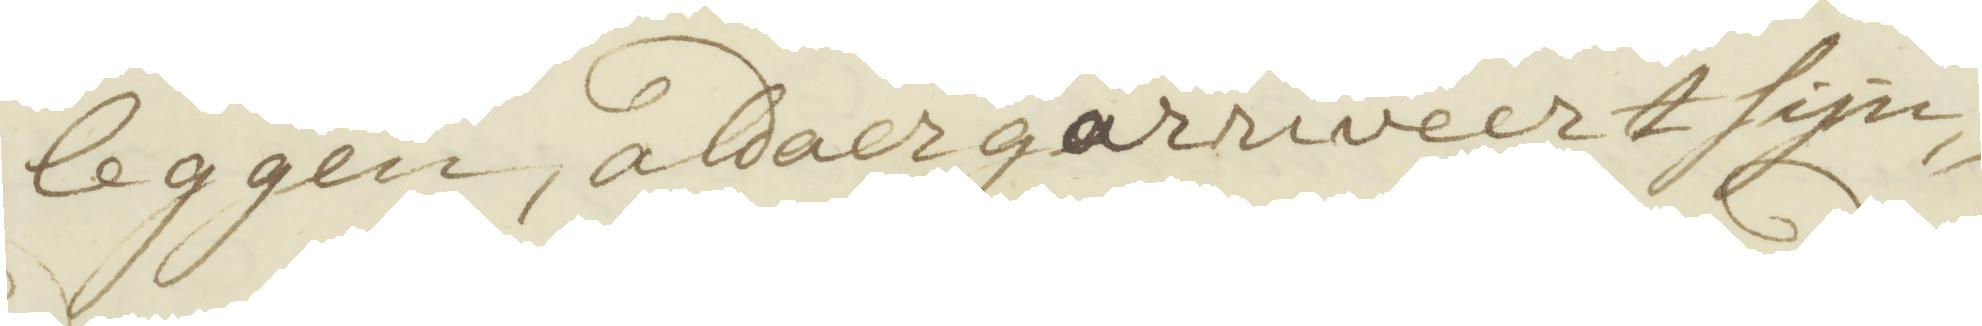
leggen, aldaer g'arriveert sijn„
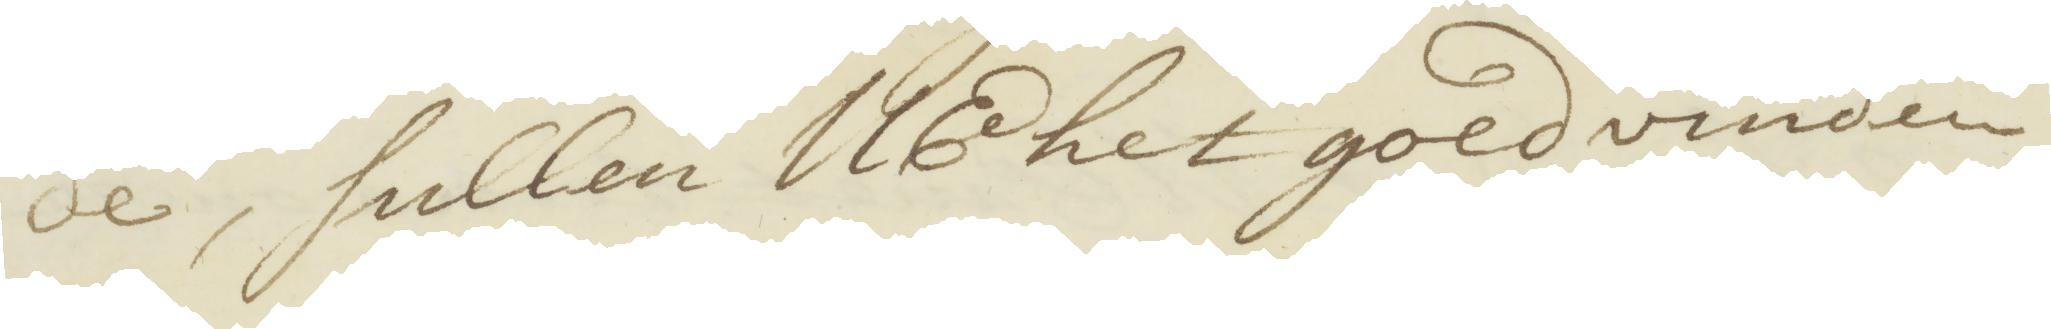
de, sullen UE het goedvinden
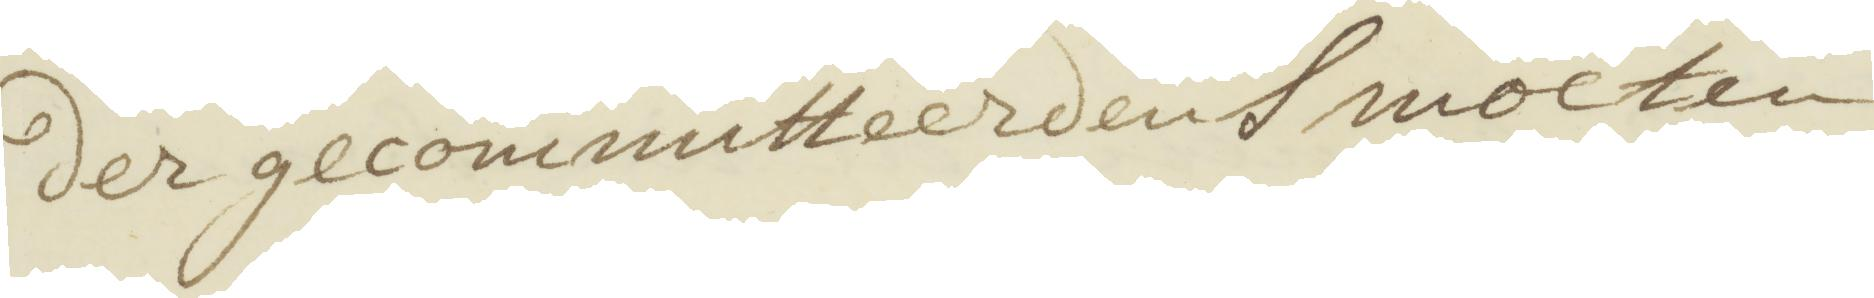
der gecommitteerdens moeten
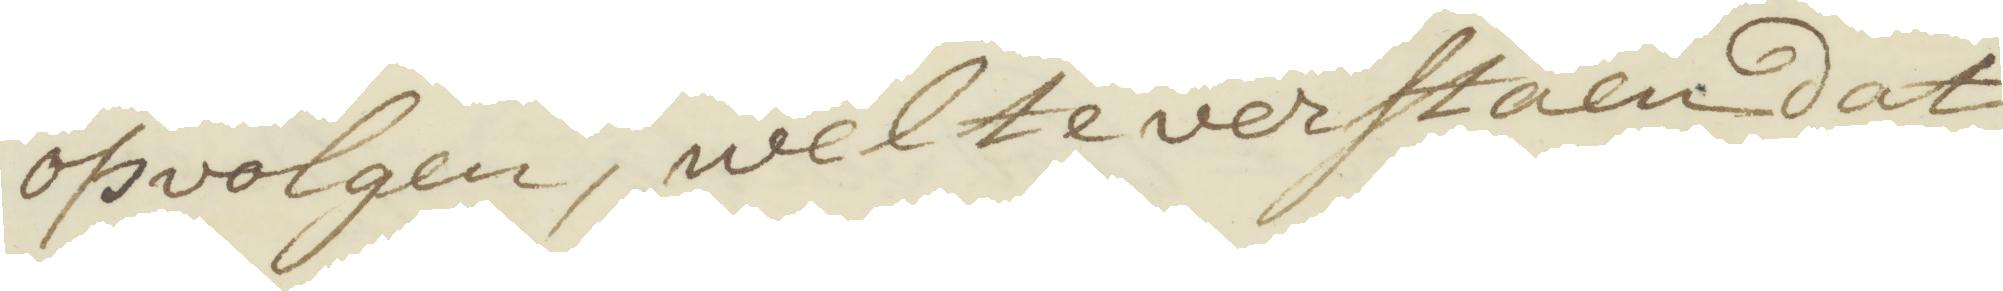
opvolgen, wel te verstaen dat
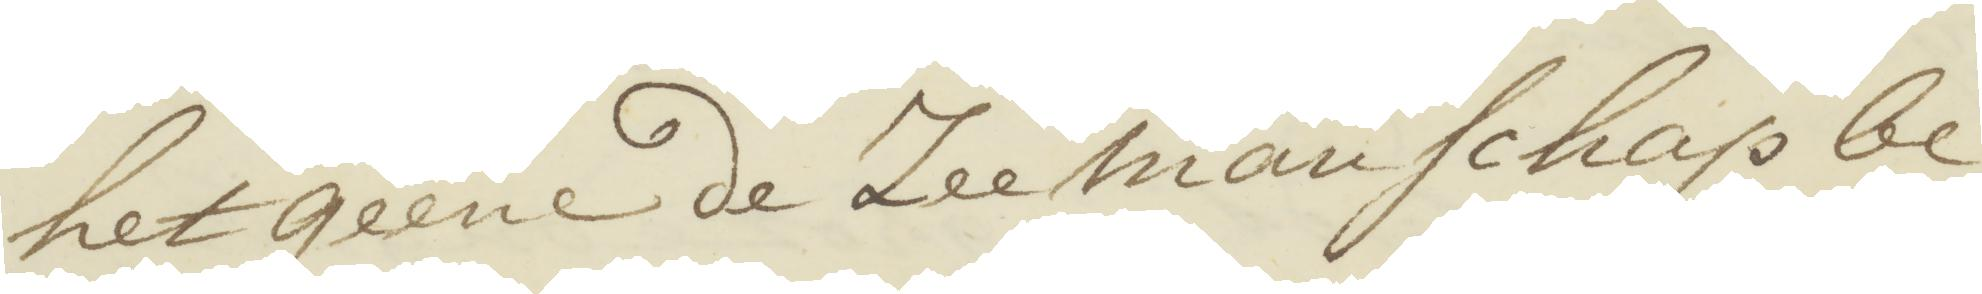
het geene de Zeemanschap be
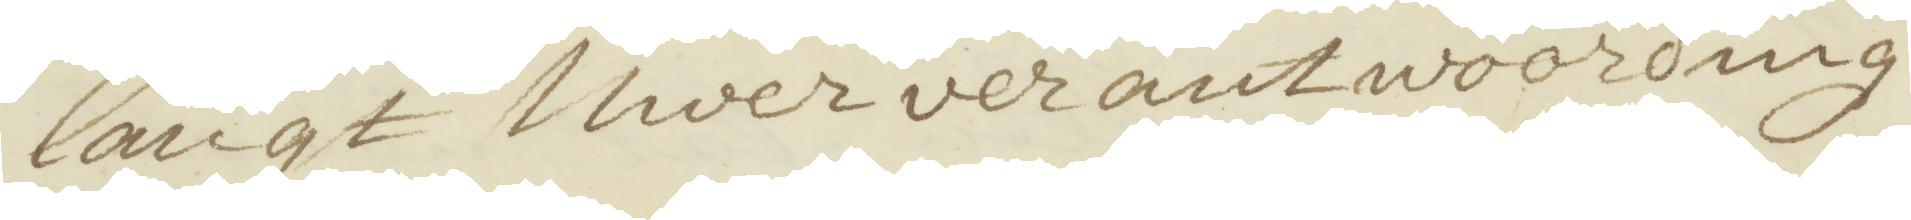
langt Uwer verantwoording
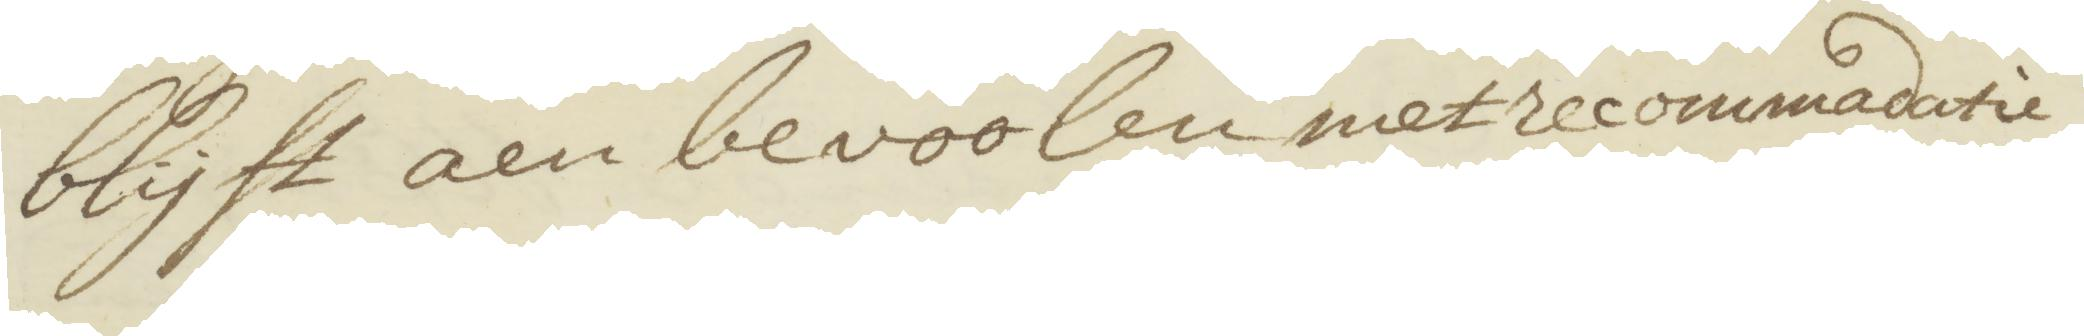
blijft aen bevoolen met recommadatie
